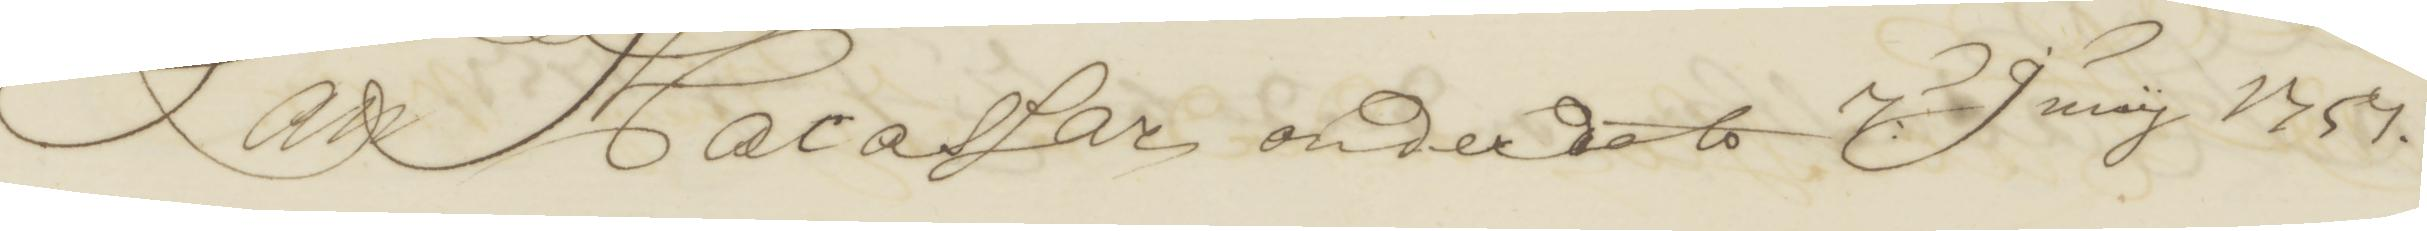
Van Macassar onder dato 7:' Junij 1757.
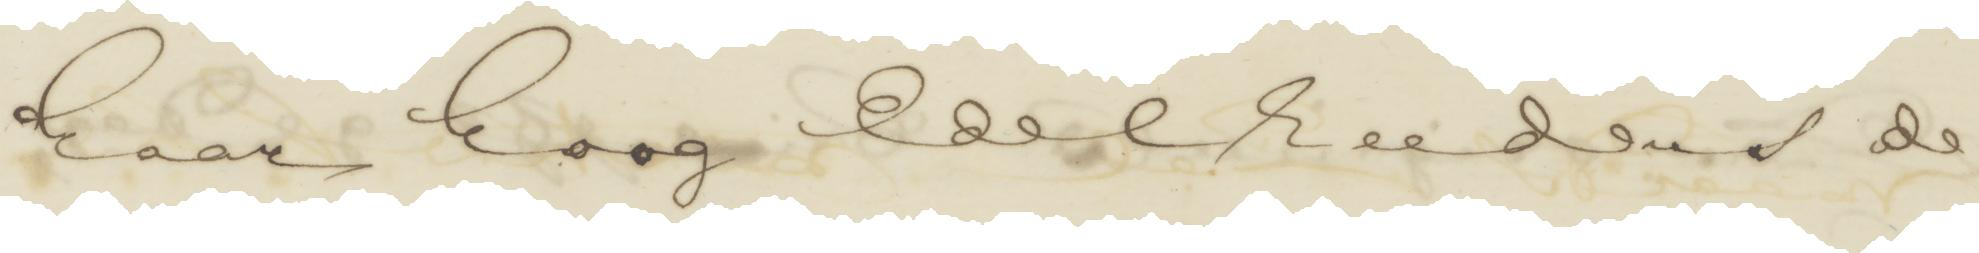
haar hoog Edelheedens de
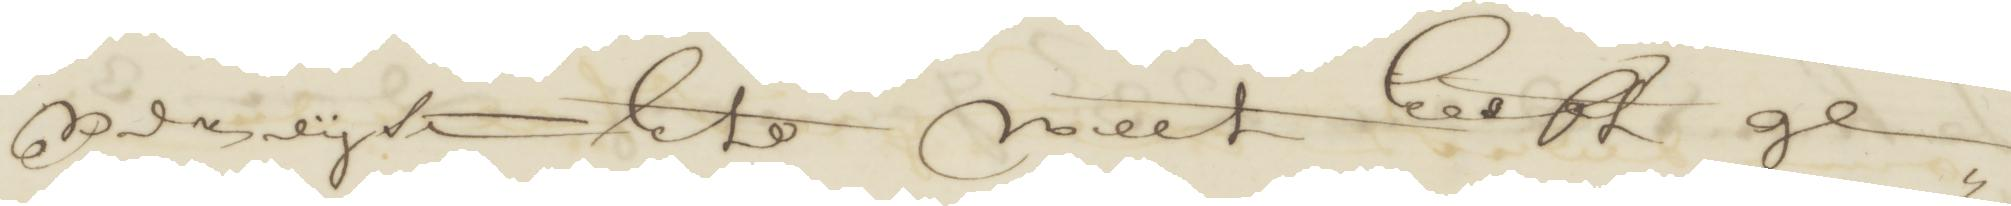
vereijschte weet heeff ge„
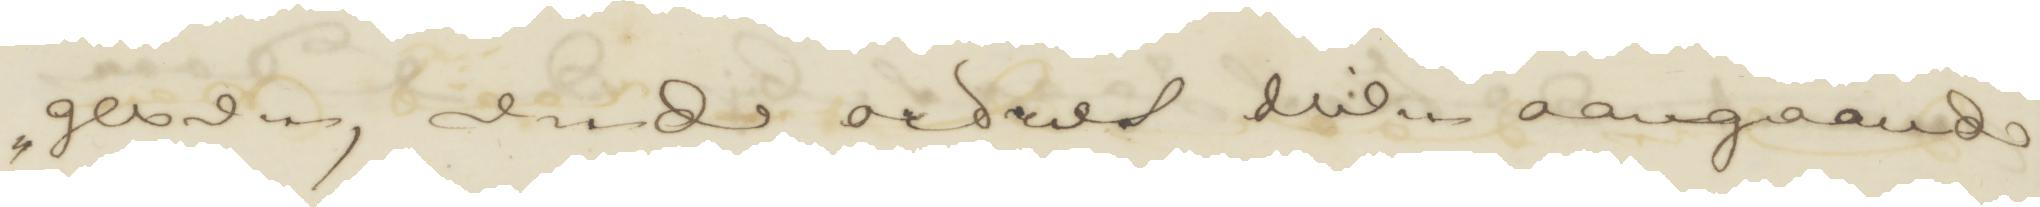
„geven, en de ordres dien aangaande
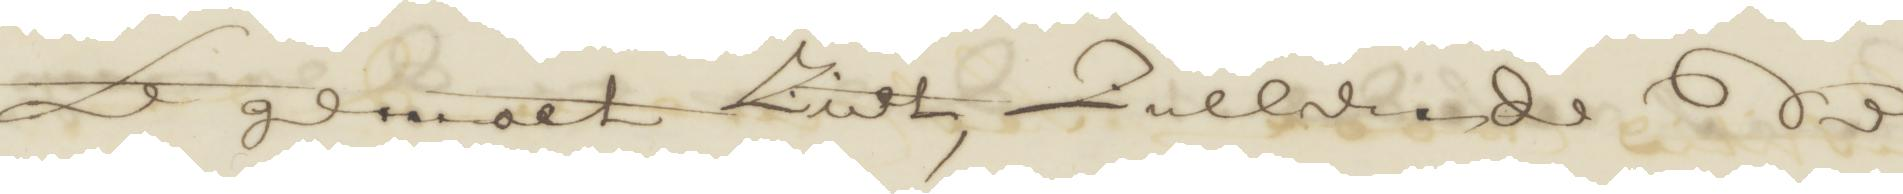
te gemoet ziet, zullende de
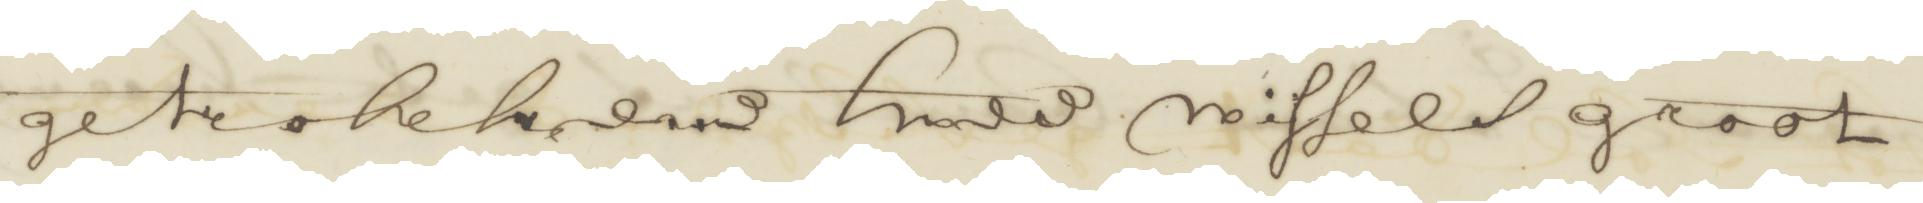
getrokkene twee wissels groot
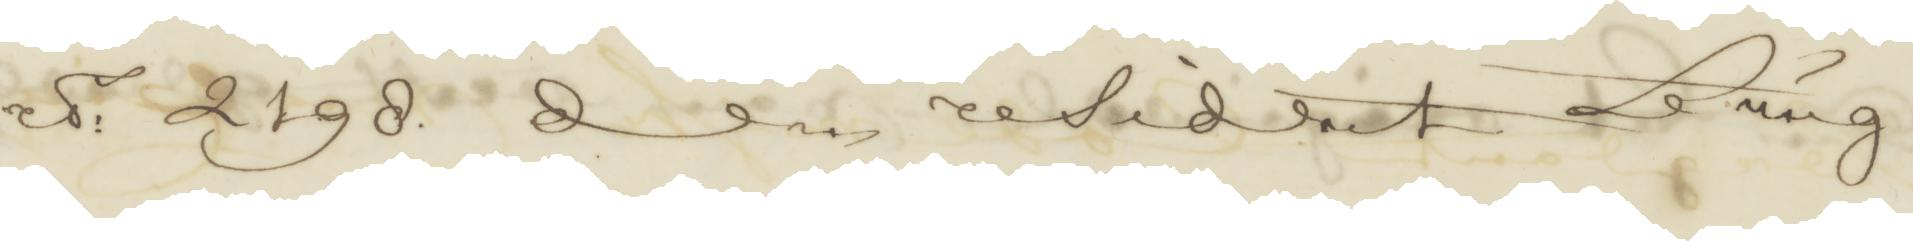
rd:s 2198. den resident terug
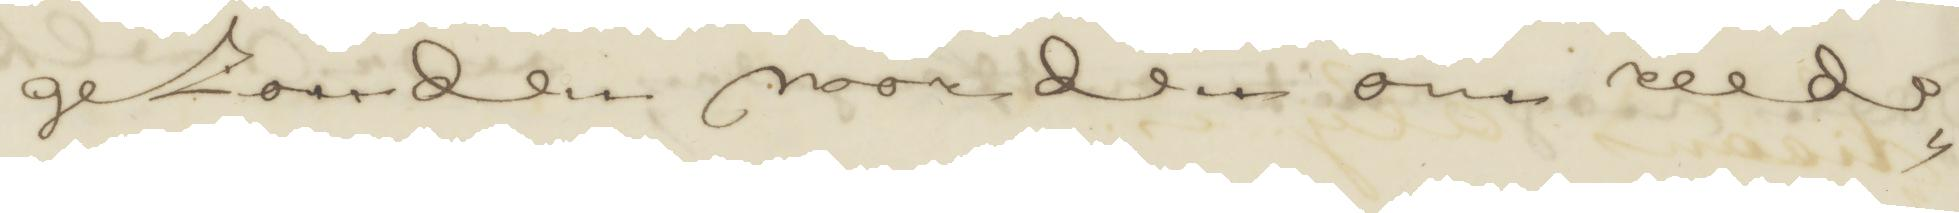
gezonden worden om reede„
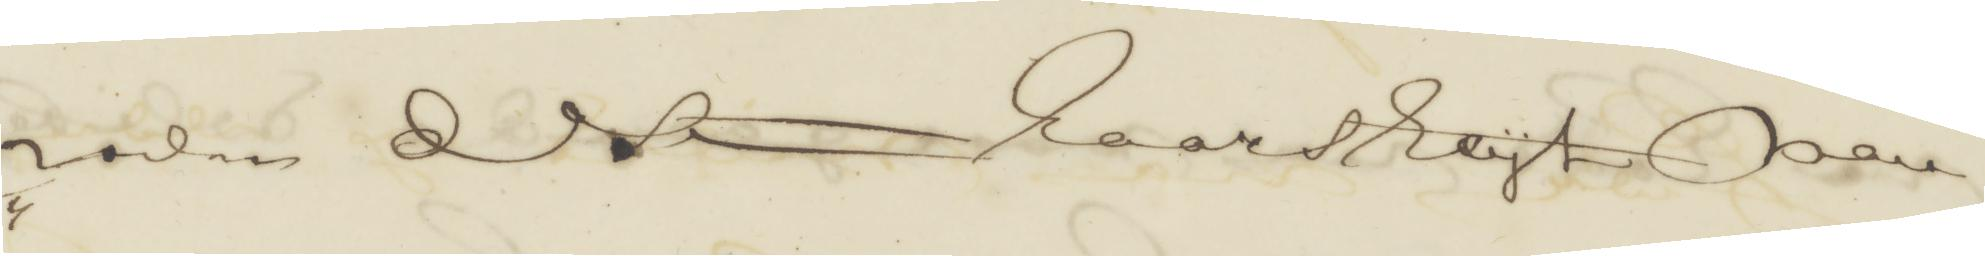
„nen de schaarscheijt van
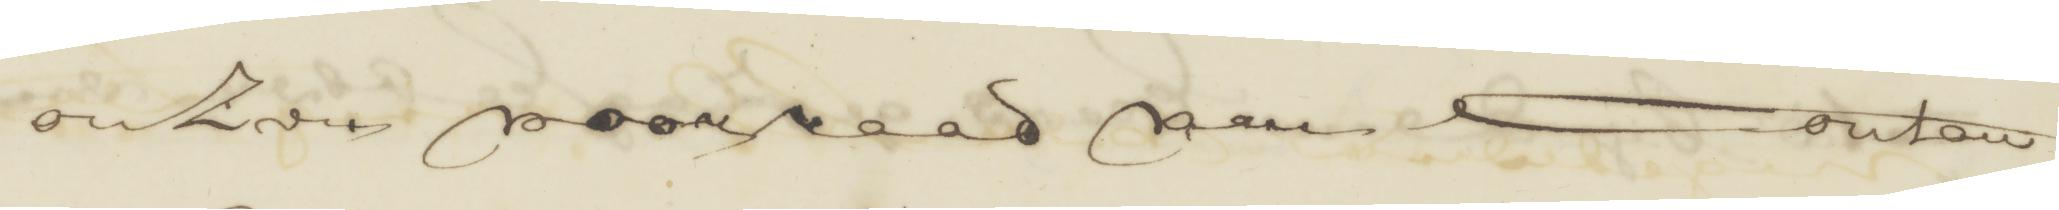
onzen voorraad van Contan
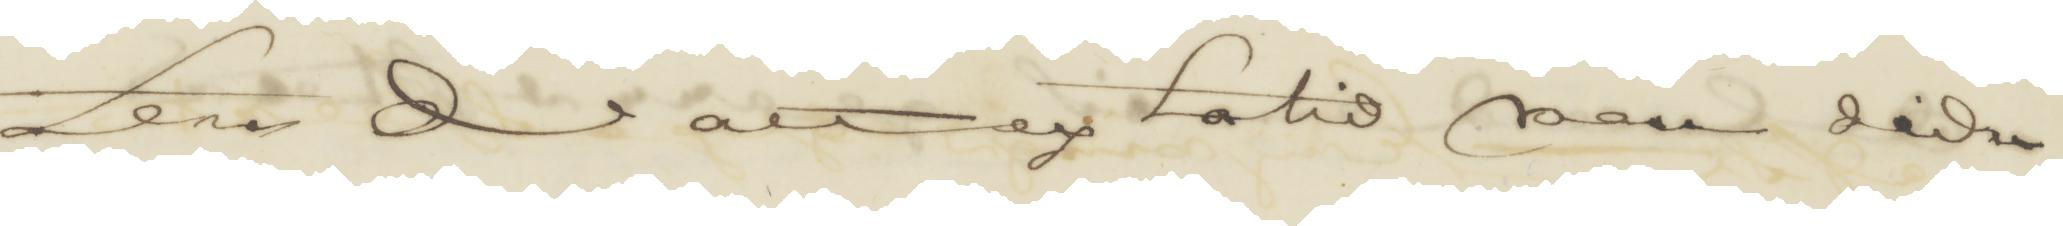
ten de acceptatie van dien
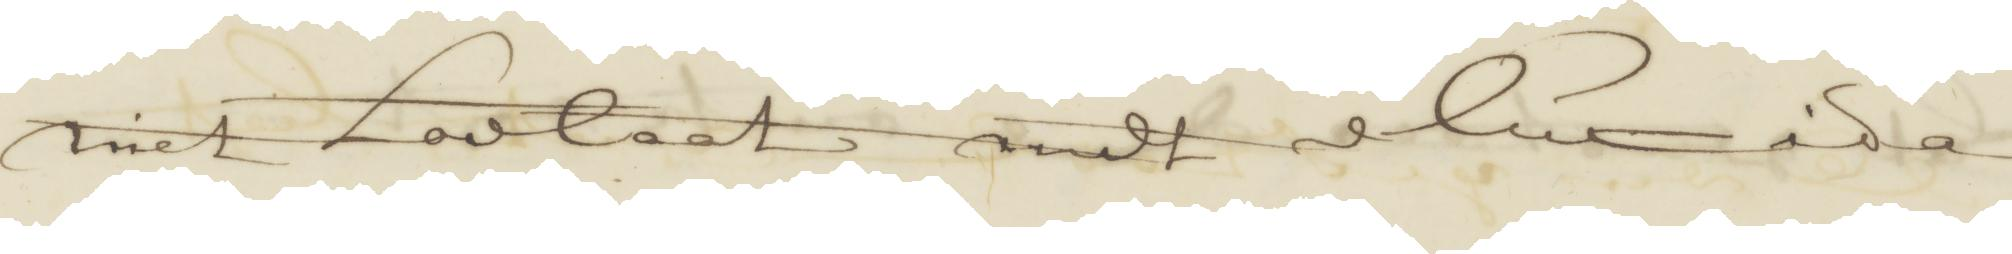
niet toelaat, met elucida
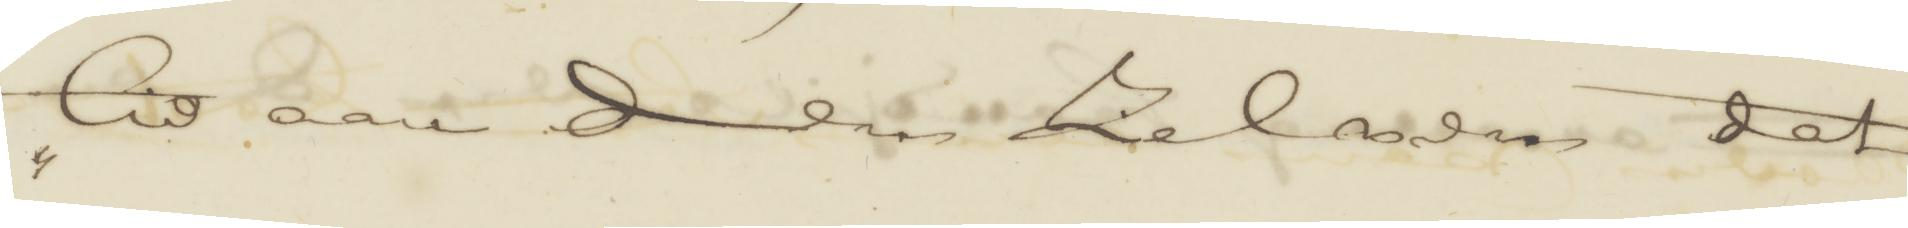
„tie aan den zelven dat
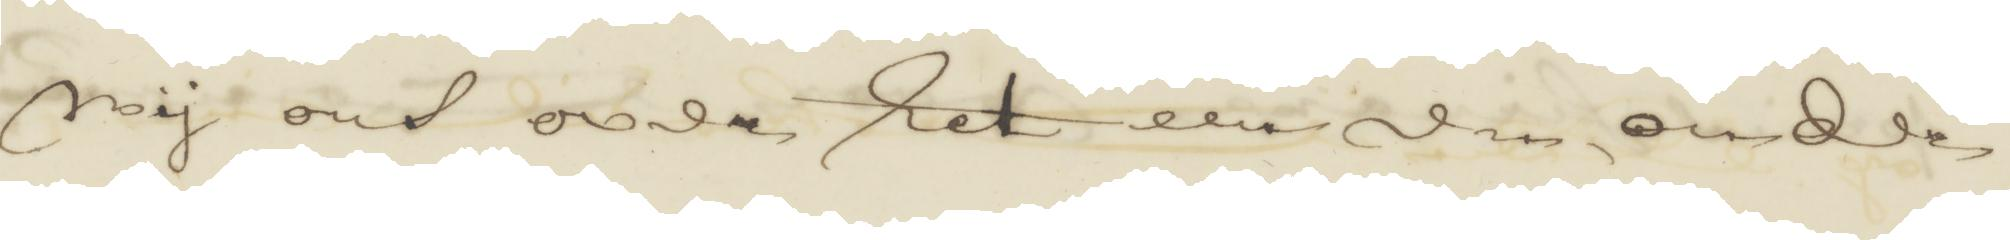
wij ons over het een en ander
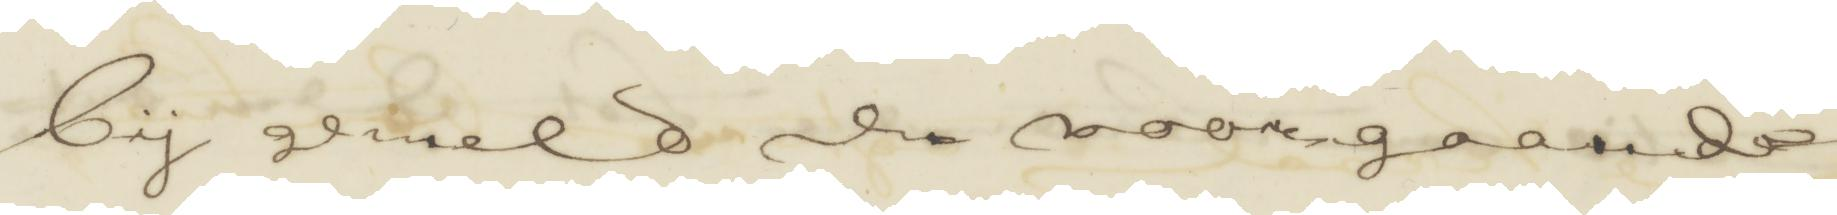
bij gemeld en voorgaande
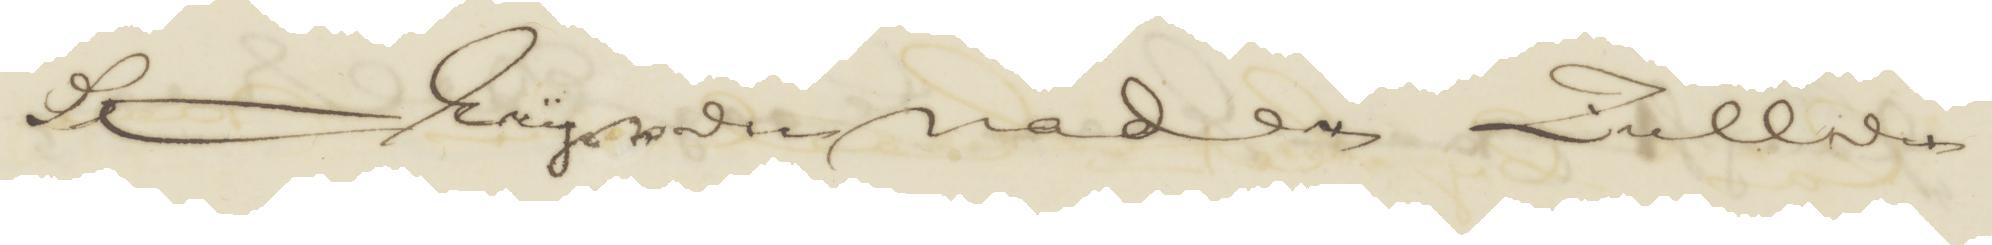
schrijven, nader zullen
